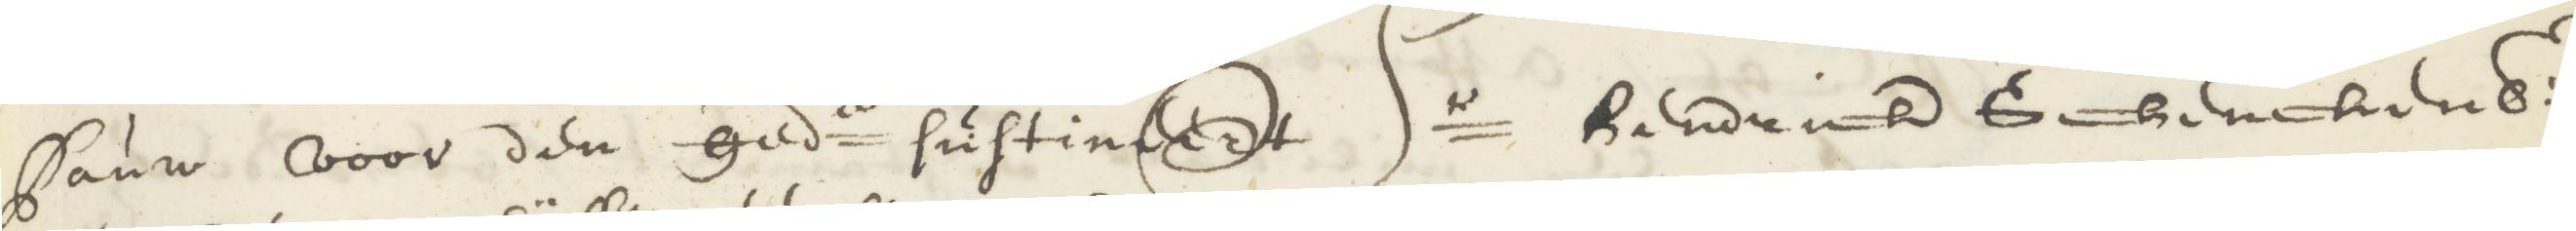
Pauw voor den ged=e sustineert H=r Hendrick Schenckens:
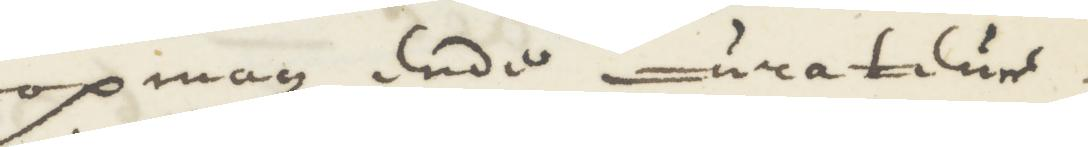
opman ende curateur
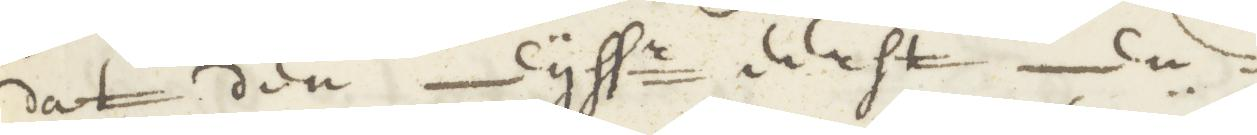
dat den eijss=r eerst en
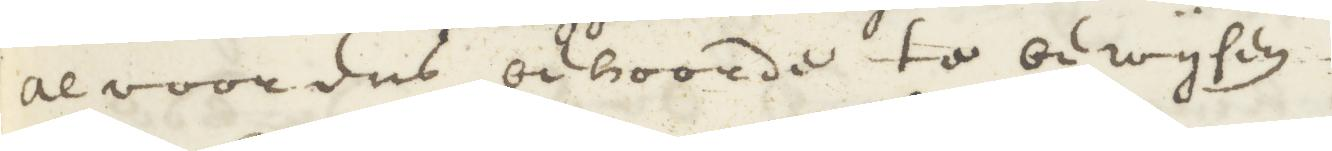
al voorens behoorde te bewijsen
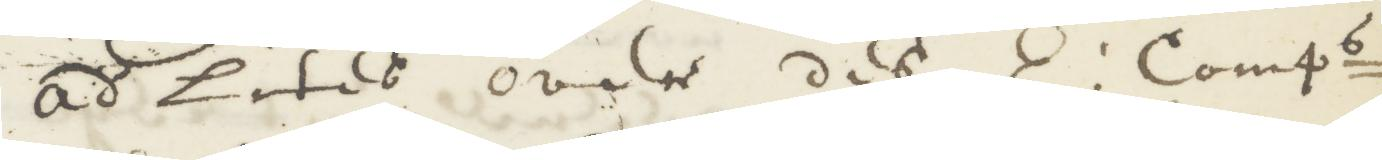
ad lites over des E: Comp=s
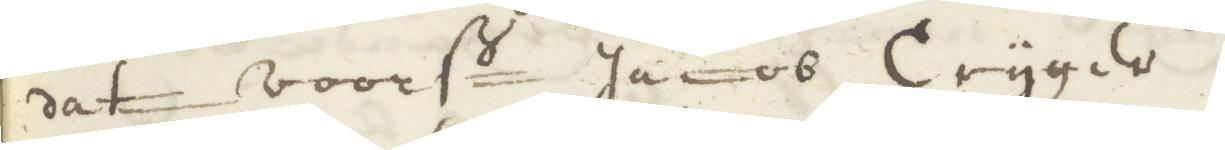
dat voors=z Jacob Crijger
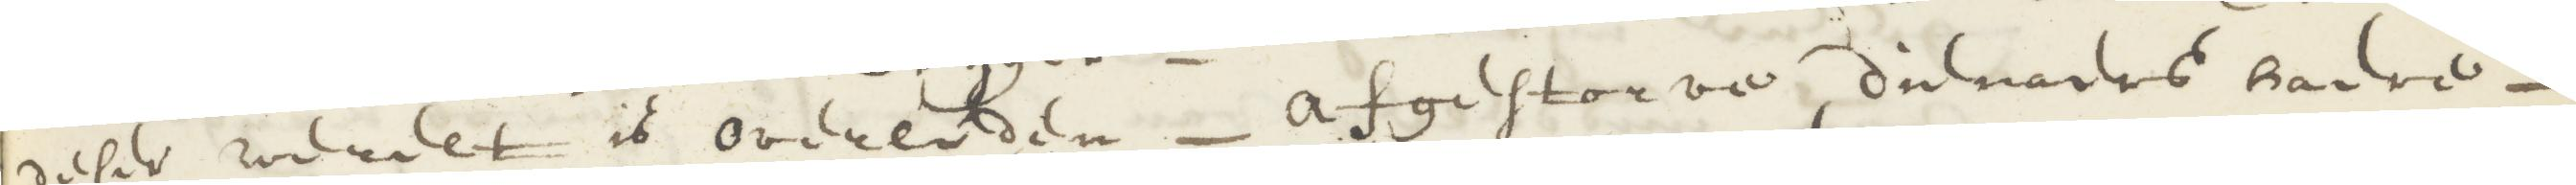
deser werelt is overleden — afgestorve dienaers haere —
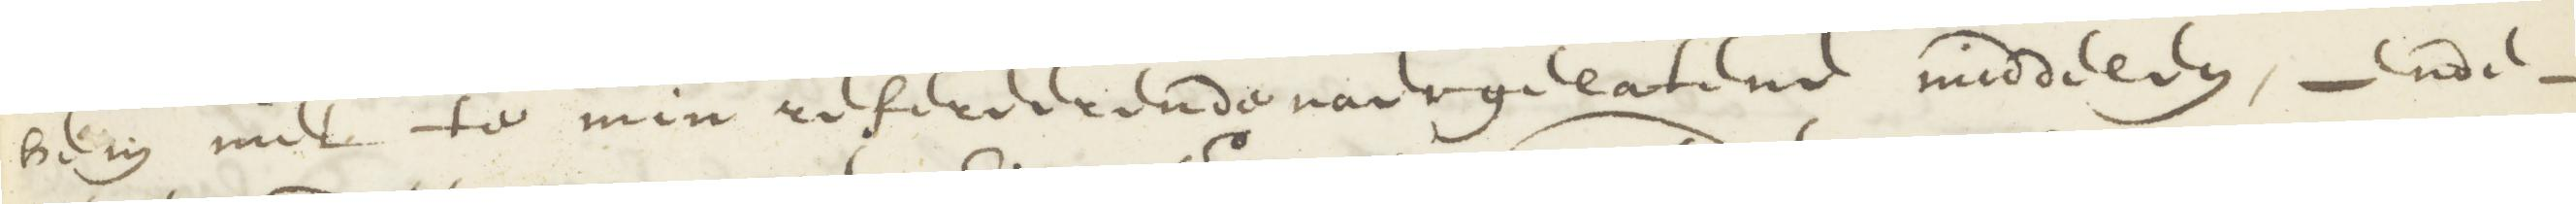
hem niet te min refereerende naergelatene middelen, ende —
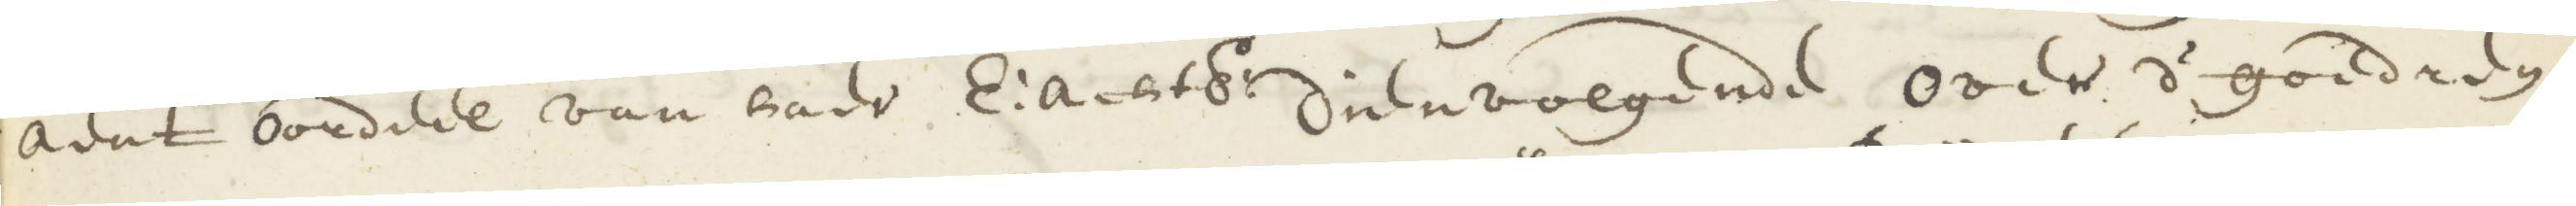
aen't oordeel van haer E: achtb: dienvolgende over d’ goedren
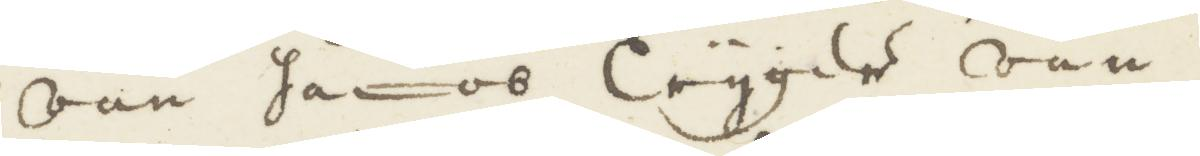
van Jacob Crijger van
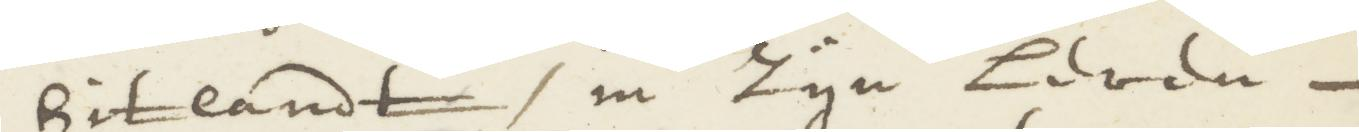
hitlandt, in zijn Leven —
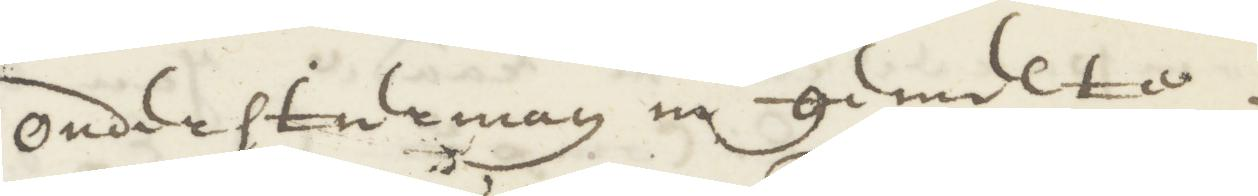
onderstierman in gemelte
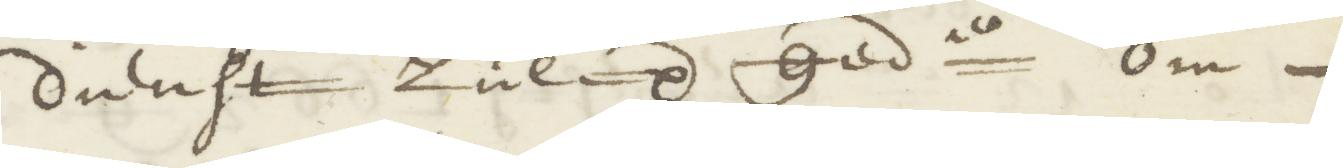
dienst zulcx ged=e om —
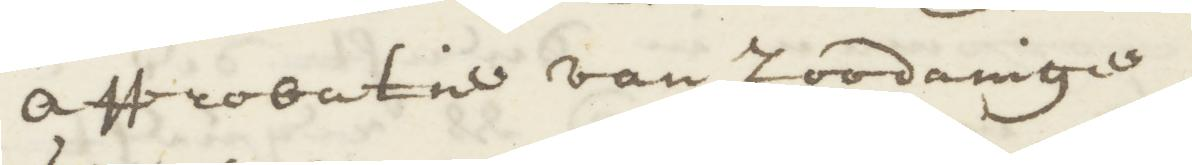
approbatie van zoodanige
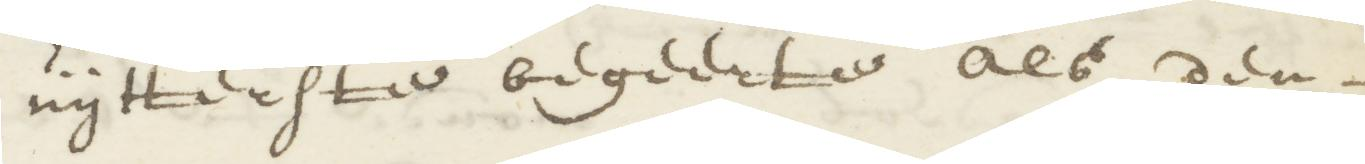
uijtterste begeerte als den
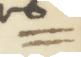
=rs
